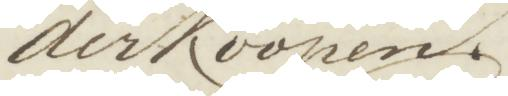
der koopen
